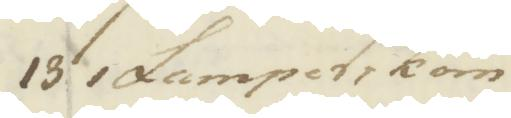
13 1 Lampet kom
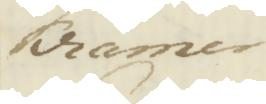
Kramer
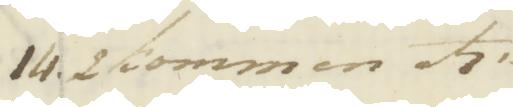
14. 2 kommen etc
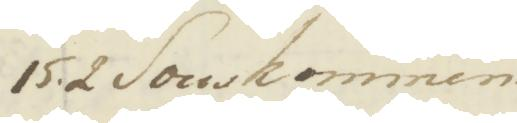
15: 2 Souskommen.
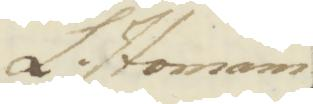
L. Homann
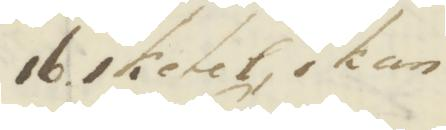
16.1 ketel 1 kan
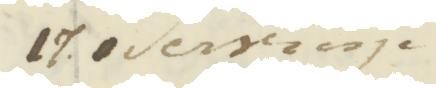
17. 0 serviesje
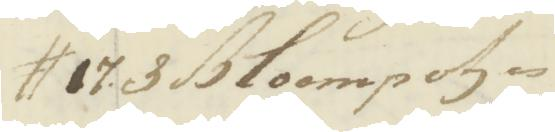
# 17:3 Bloempotjes
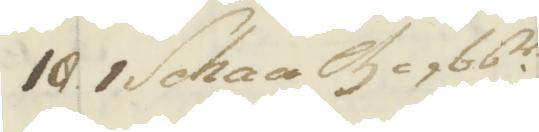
18. 1 schaaltje gbb
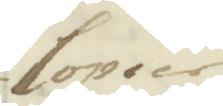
Copier
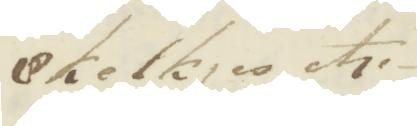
8 kelkjes etc
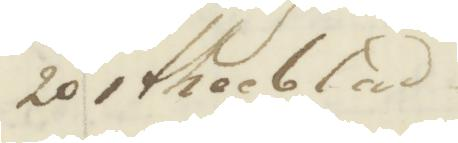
20 1 theeblad
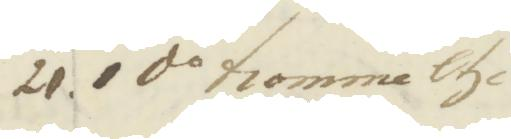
21.1 do trommeltje
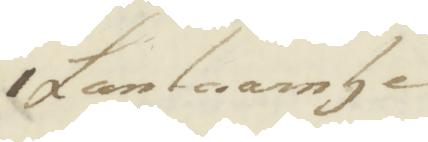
1. Lantaarntje
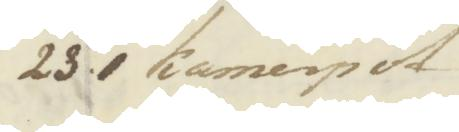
25. 1 kamerpot
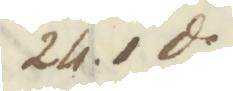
24.1 d.o
